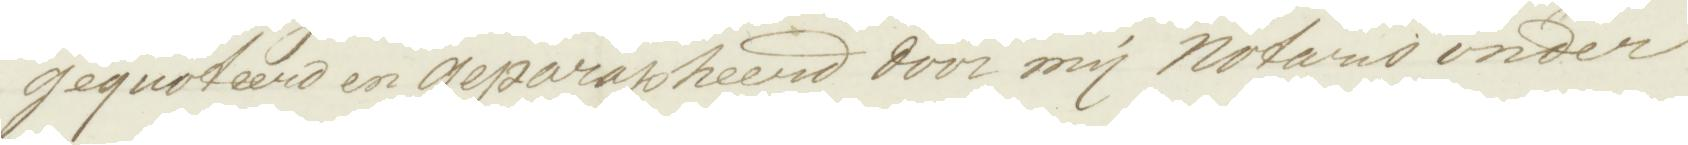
gequoteerd en geparapheerd door mij Notaris onder
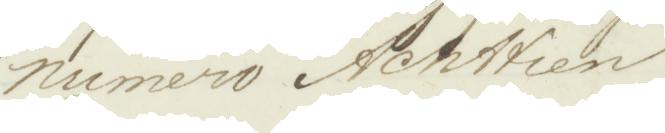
numero Achttien
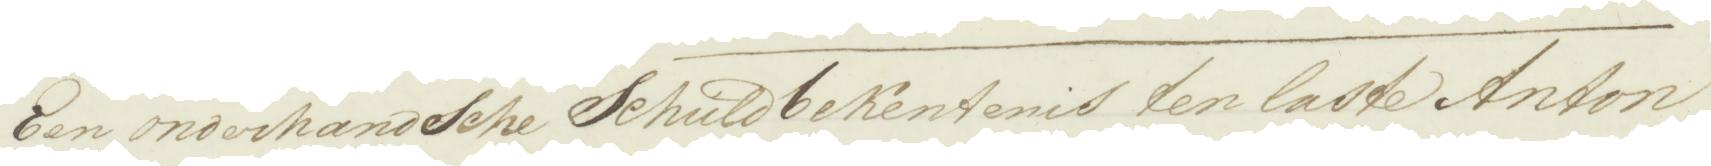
Een onderhandsche Schuldbekentenis ten laste Anton
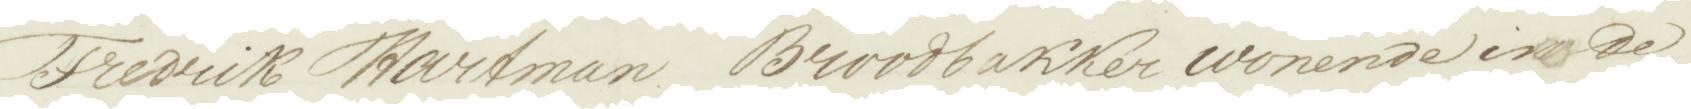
Fredrik Hartman Broodbakker wonende in de
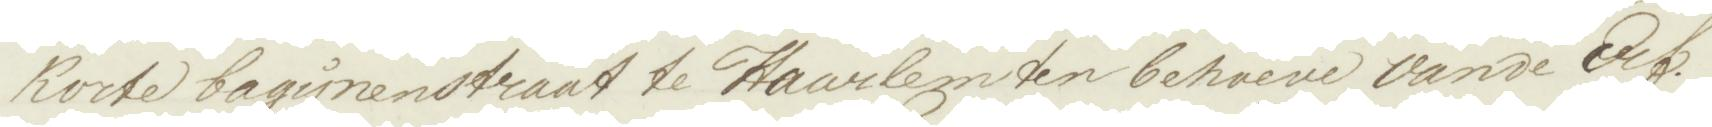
Korte bagijnenstraat te Haarlem ten behoeve vande Erf.
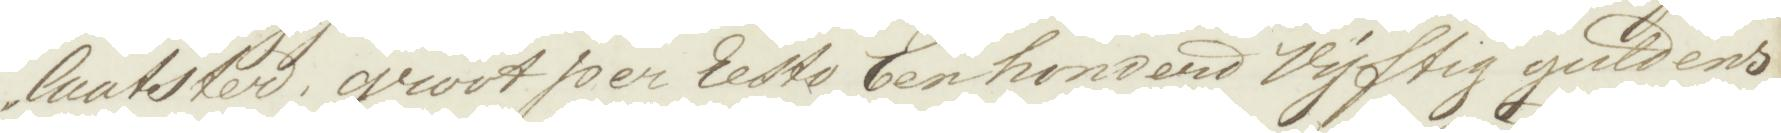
„laatster, groot per resto Een honderd Vijftig guldens
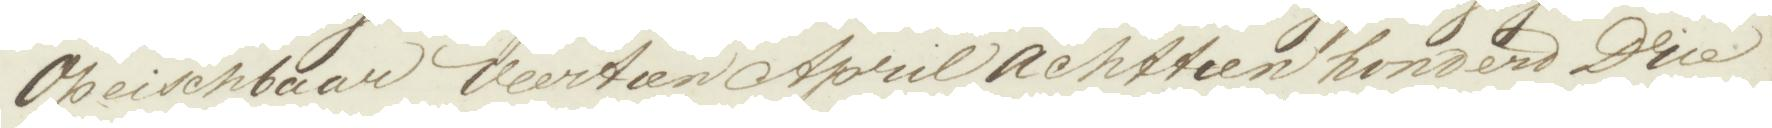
Opeischbaar veertien April achttien honderd Drie
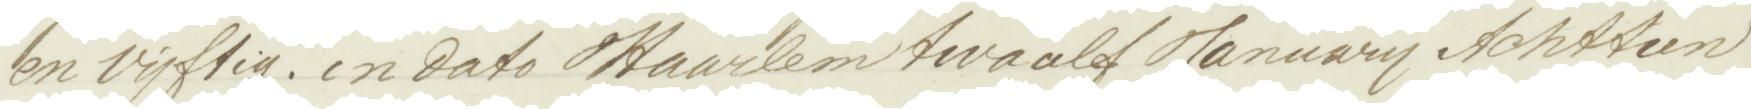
en vijftig. in dato Haarlem twaalf Januarij Achttien
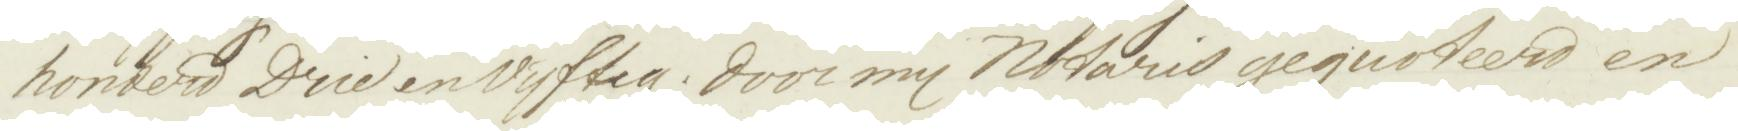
honderd Drie en vyftig. door my Notaris gequoteerd en
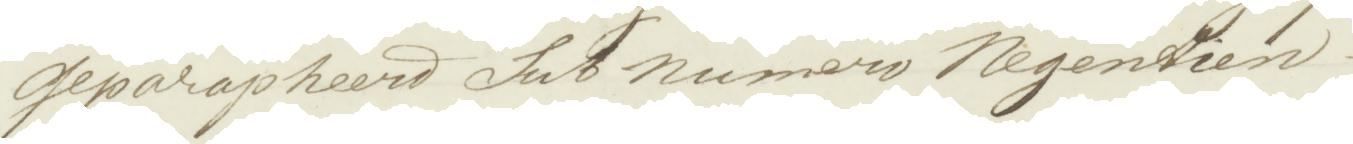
geparapheerd sub numero Negentien
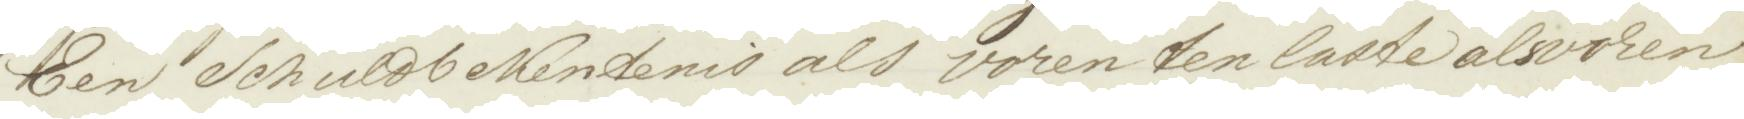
Een schuldbekentenis als voren ten laste alsvoren
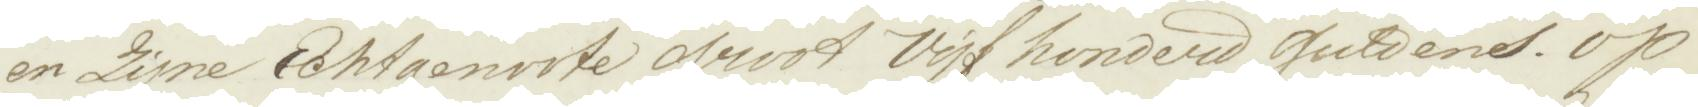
en zijne Echtgenoote groot vijf honderd guldens. op
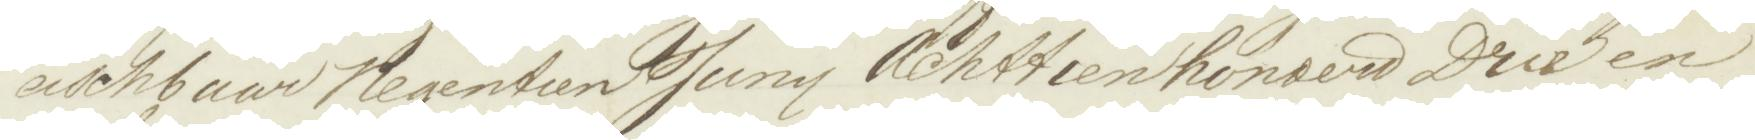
eischbaar Negentien Junij Achttien honderd Drie en
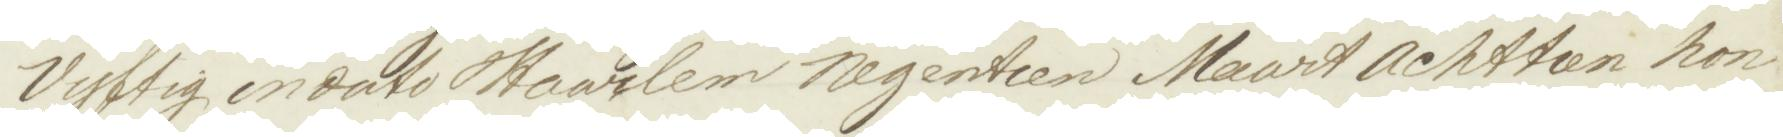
Vyftig in dato Haarlem negentien Maart achttien hon
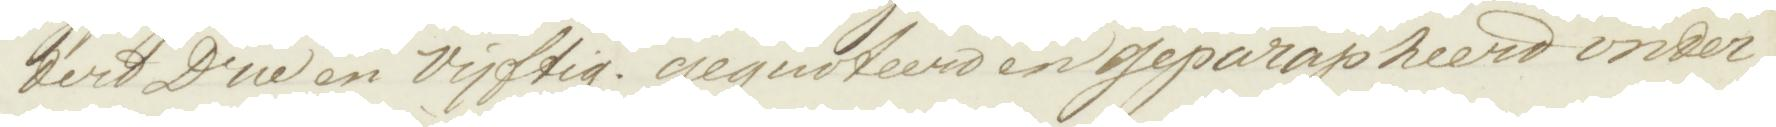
derd Drie en Vijftig. gequoteerd en geparapheerd onder
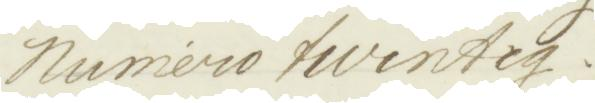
Numero twintig
